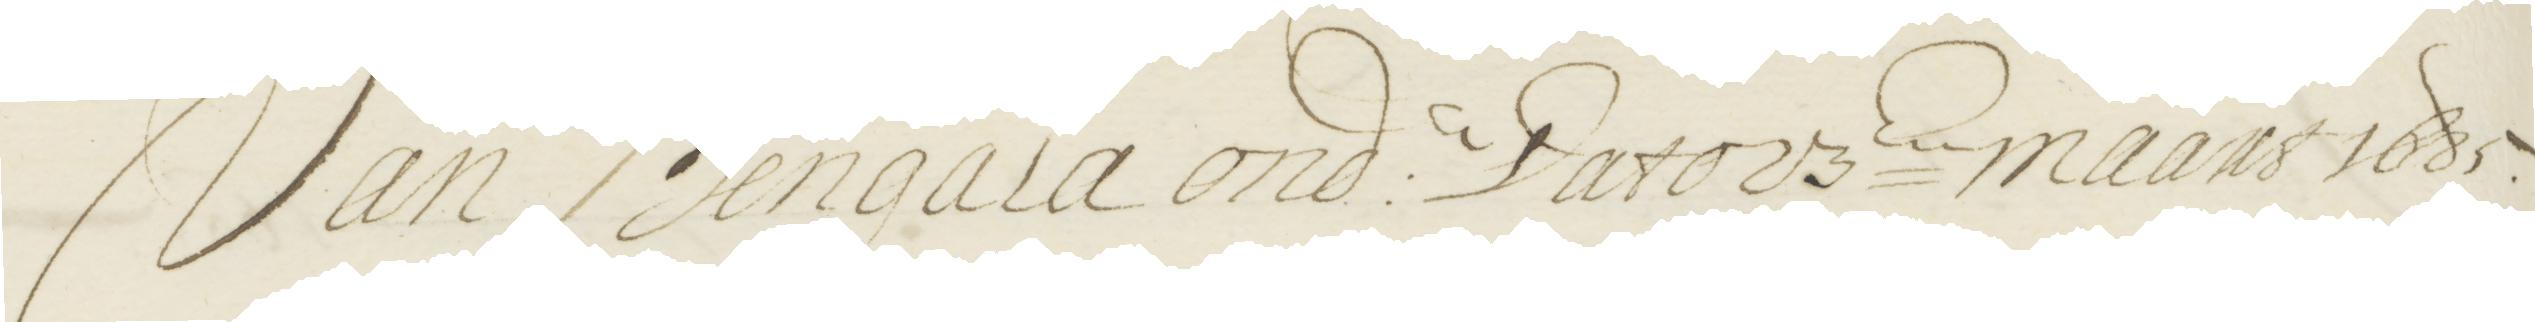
Van Bengala ond: dato 23=en maart 1685.
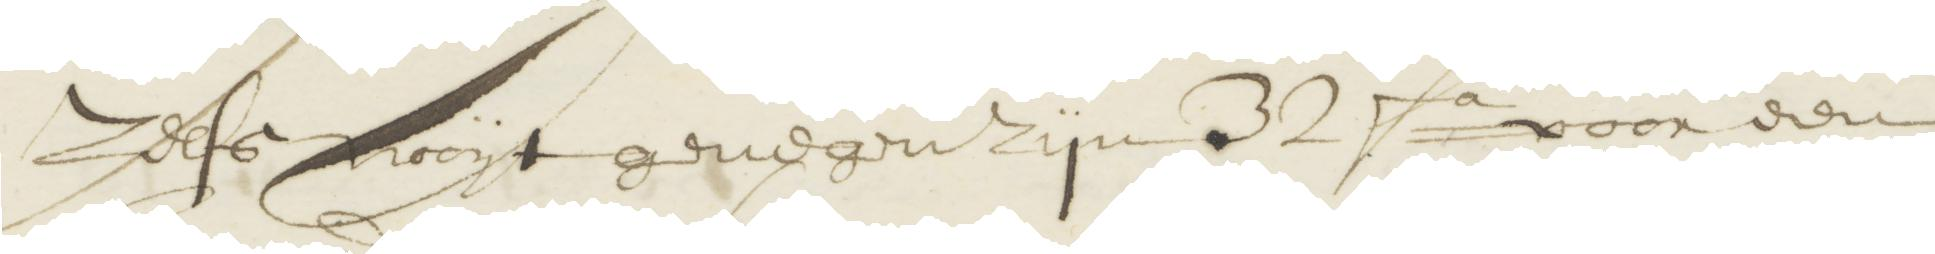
Zelfs nooijt genegen zijn 32 f=a voor een
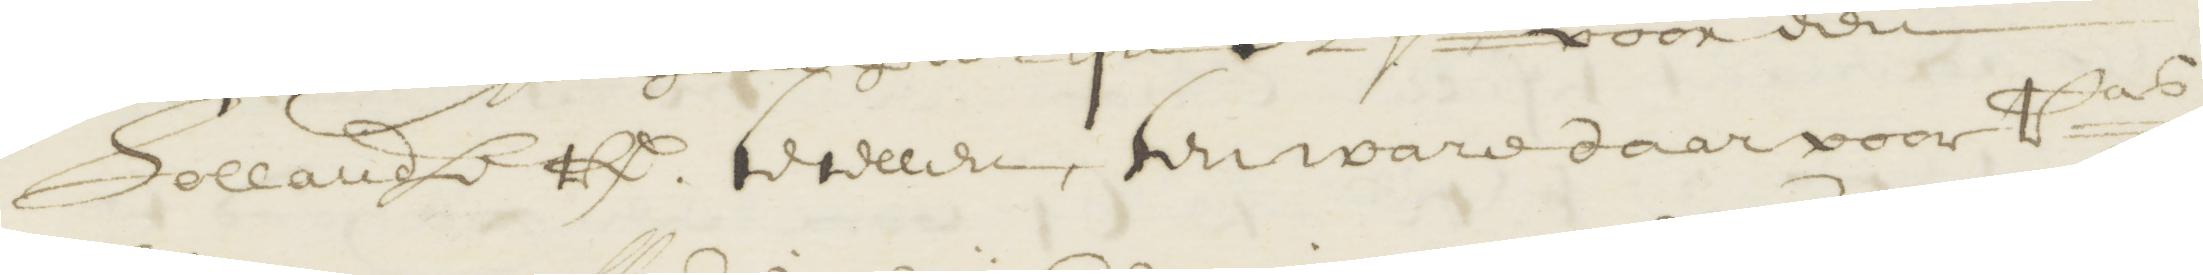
Hollandse R:d te tellen, ten ware daar voor R=as
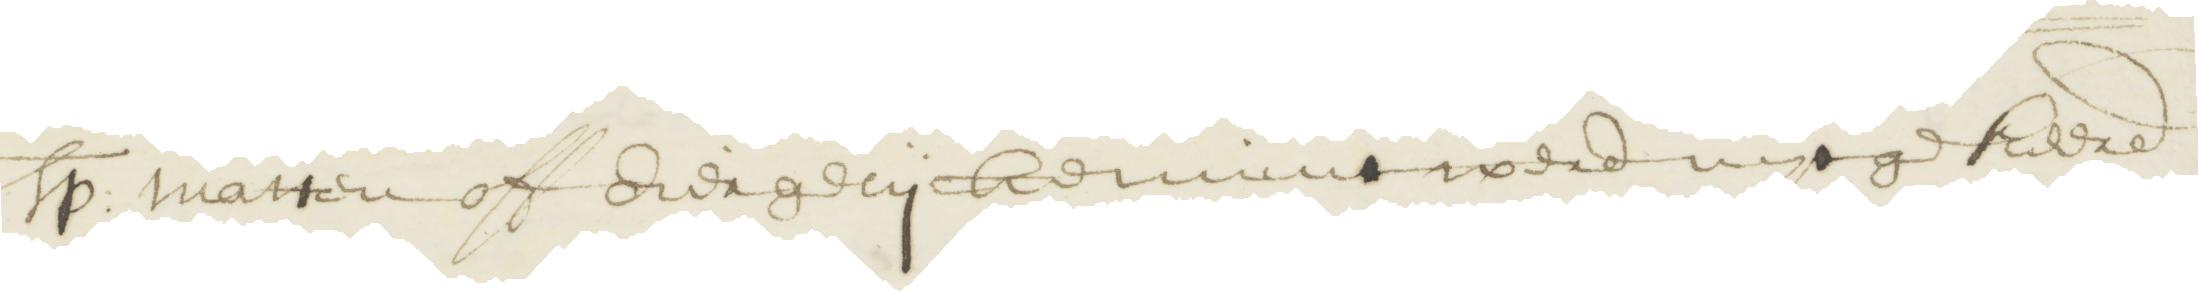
Sp: matten off diergelijcke munt werd uijt gekeerd
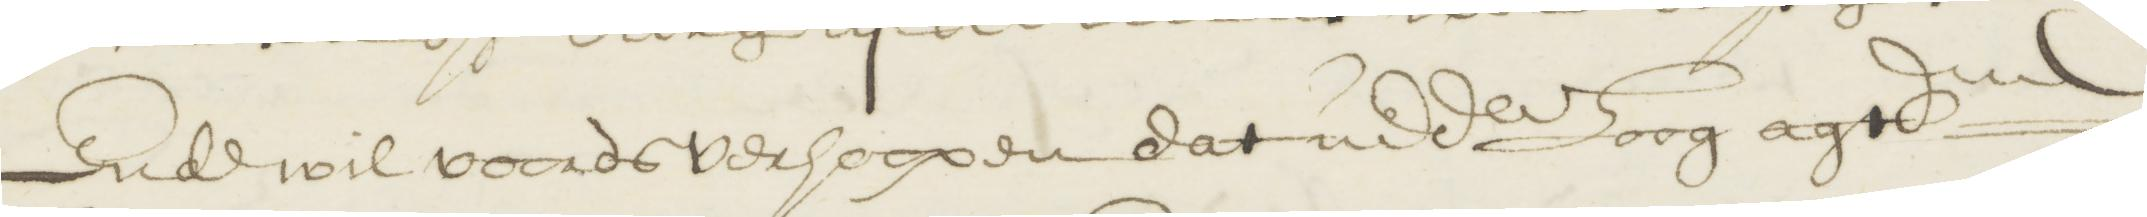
Ende wil voords verhoopen dat u Ed=le Hoog agtb:e
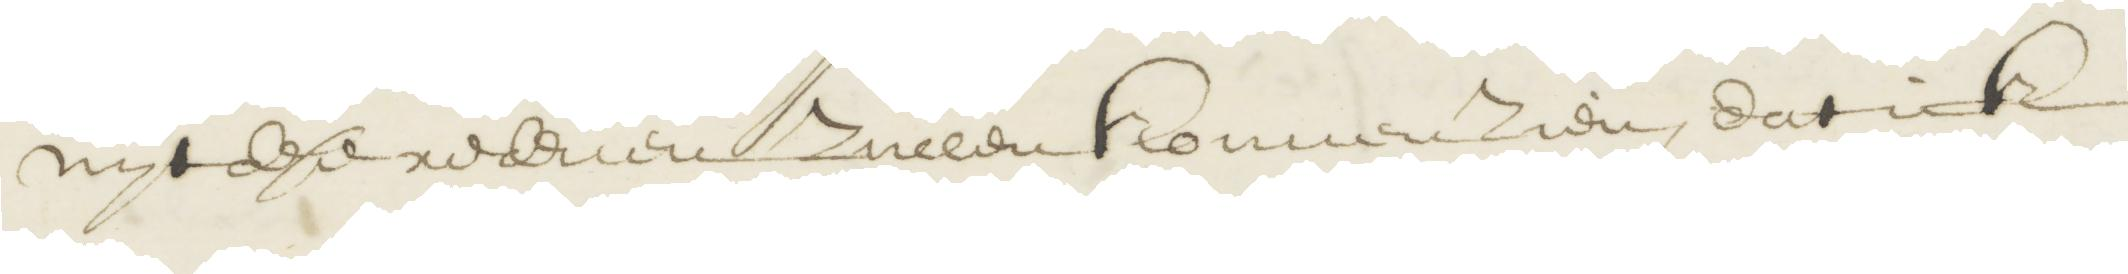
uijt dese redenen Zullen konnen zien, dat ick
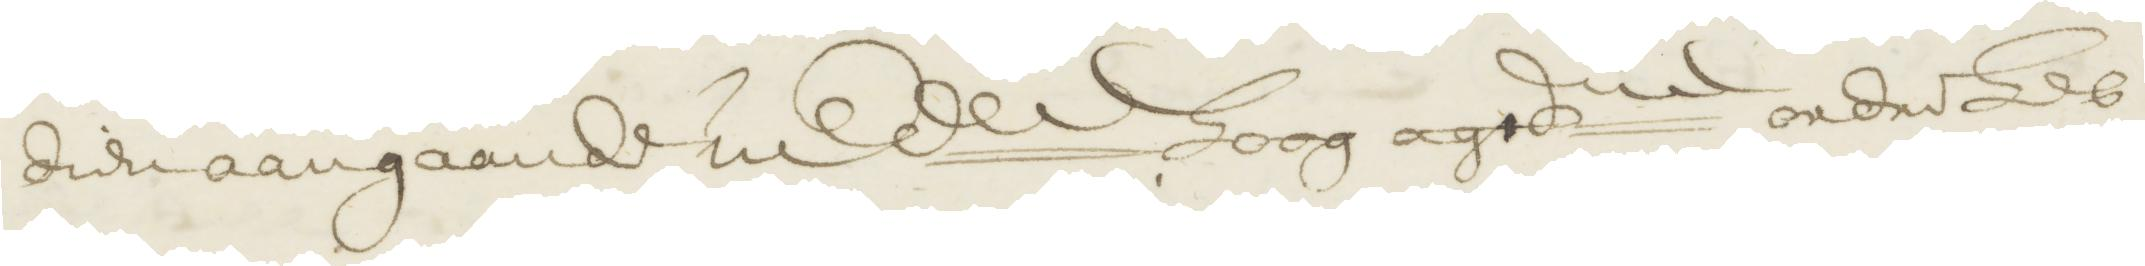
dien aangaande u Edle Hoog agtb=re ordre heb
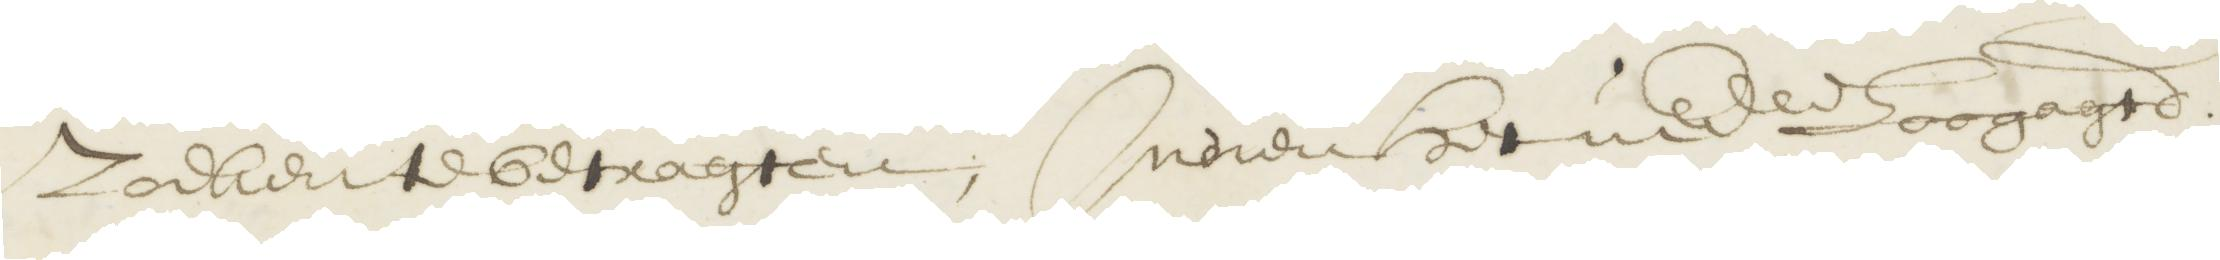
Zoeken te betragten; Jndien het uEd=le hoog agtb:
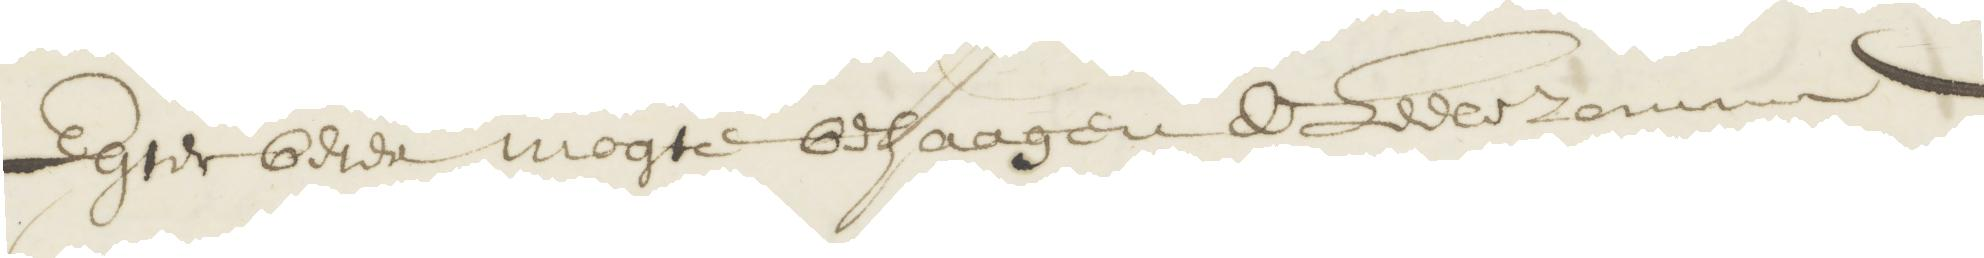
Egter beter mogte behaagen de heele zomme
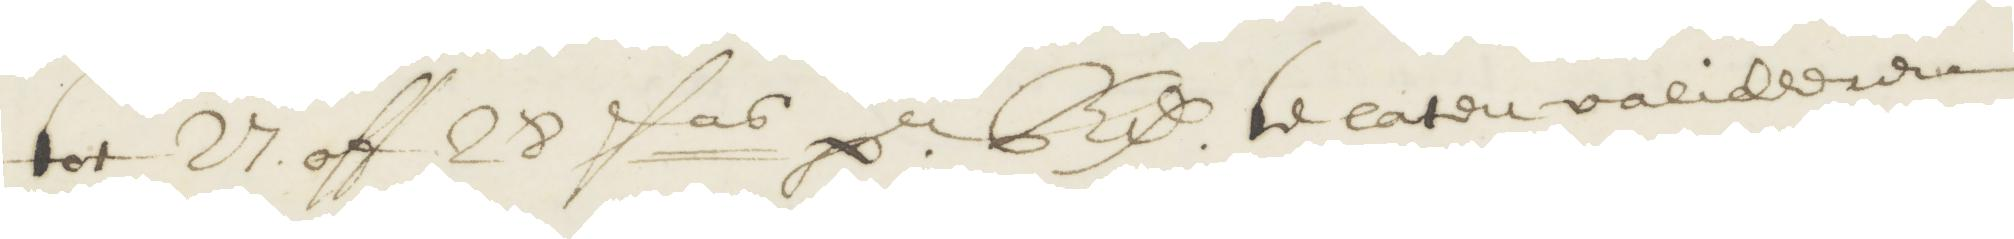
tot 27. off 28 f=as p:r Rd te laten valideeren
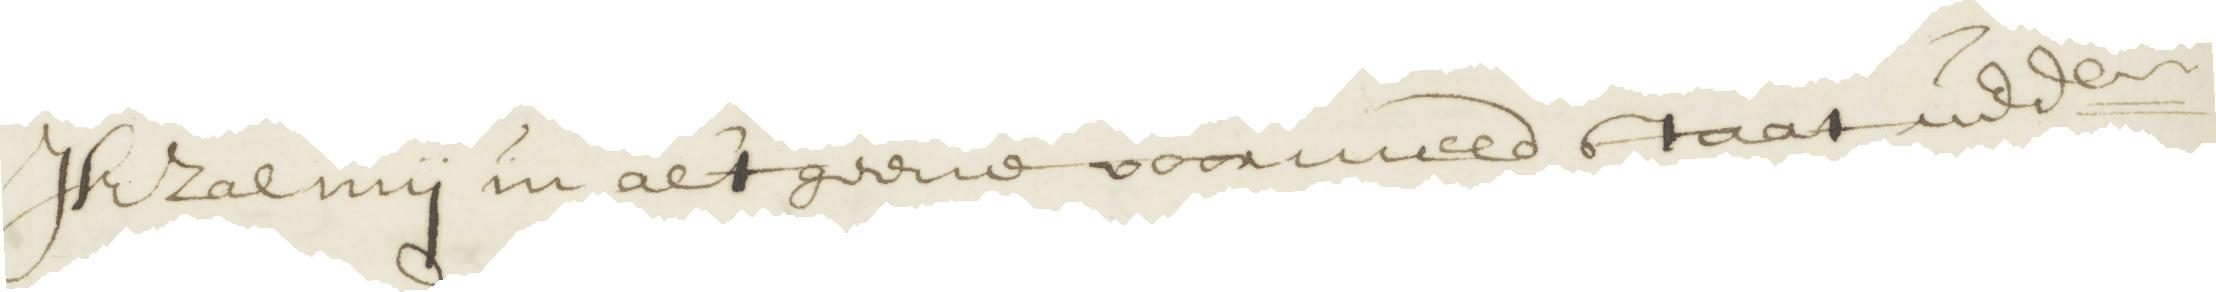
Ik Zal mij in al 't geene voormeld staat u Ed=le
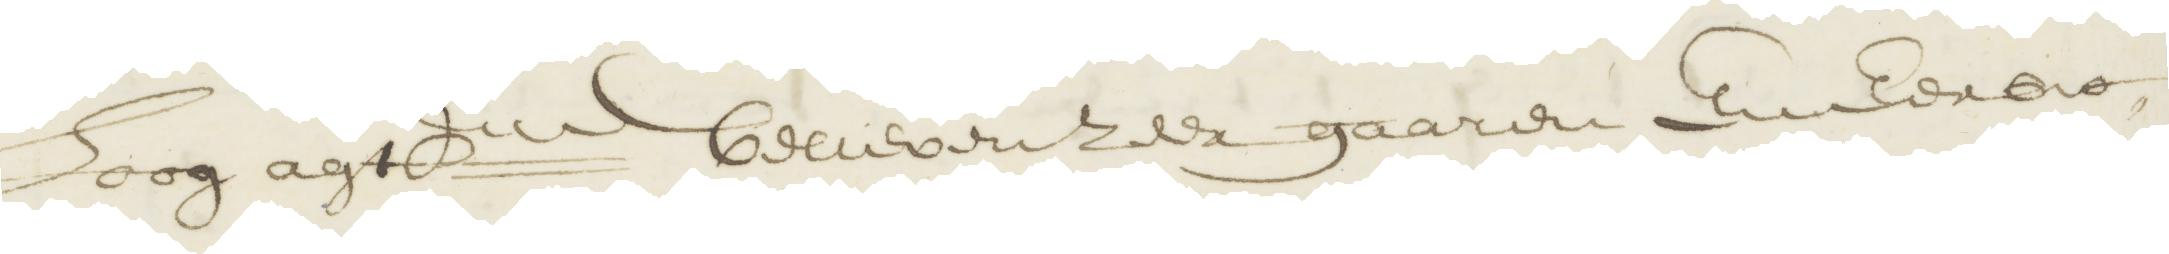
Hoog agtb=re believen zeer gaaren En Eerbie„
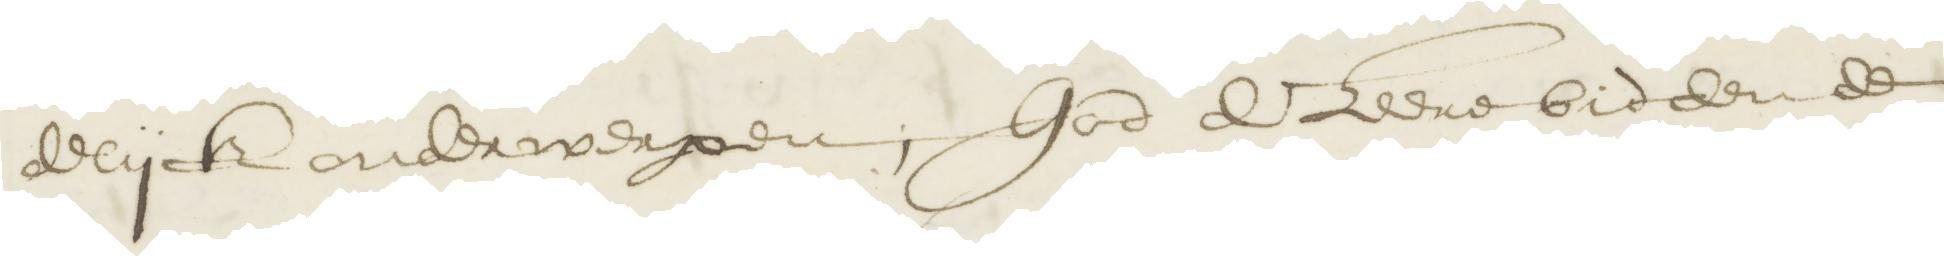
delijck onderwerpen; God de heere bidden de
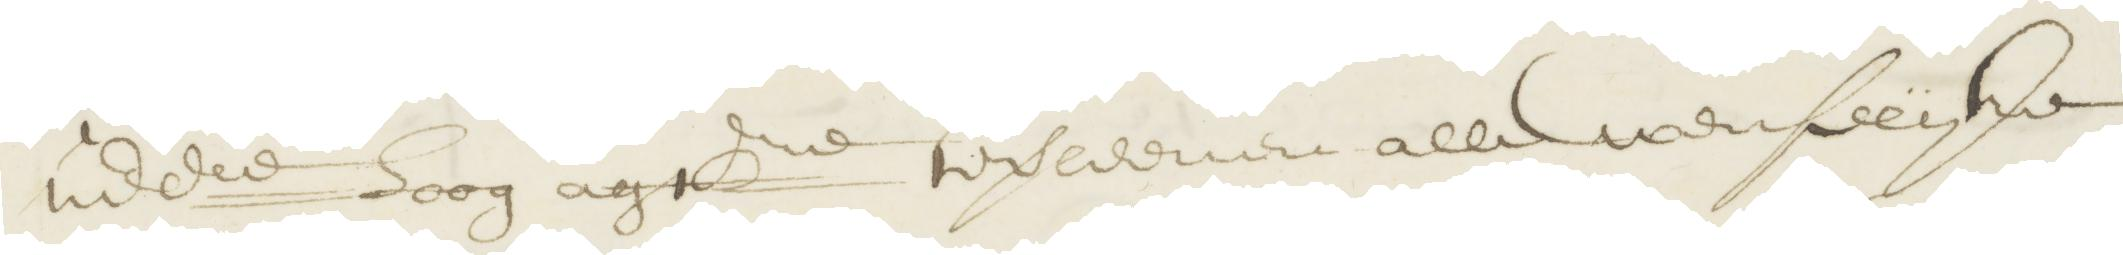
uEd=le Hoog agtb=e te verleenen alle wenselijke
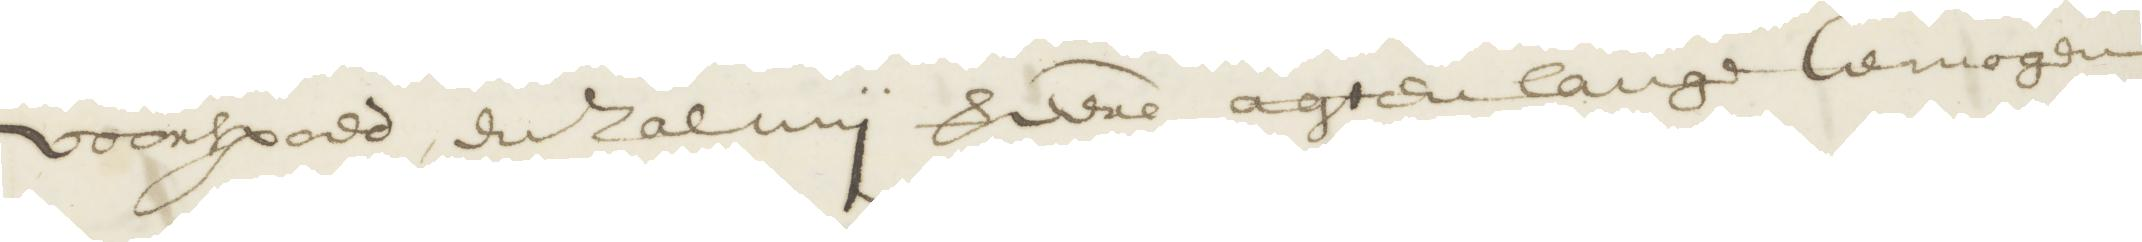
voorspoed, en Zal mij vereerd agten lange te mogen
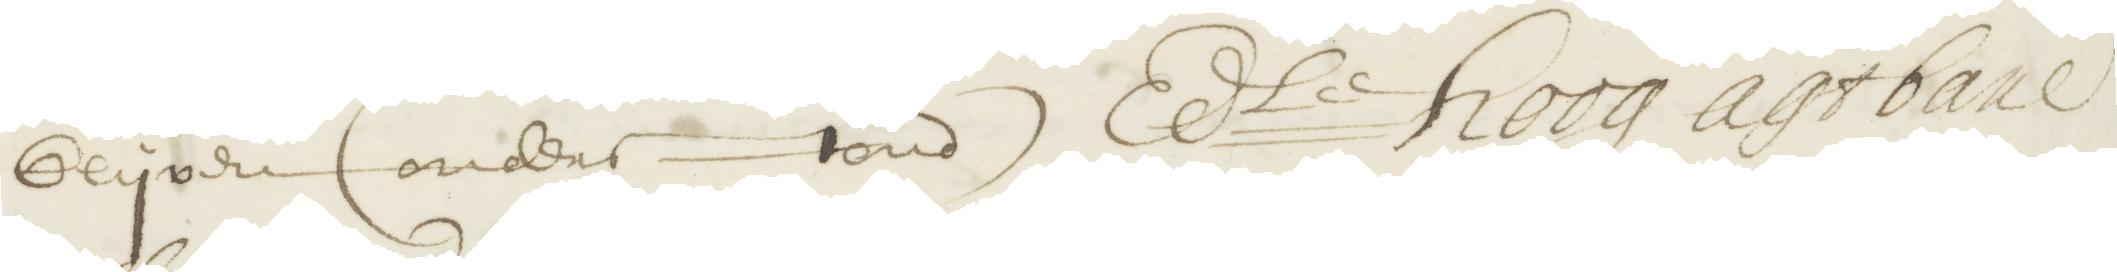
blijven ( onderstond) Ed=le hoog agtbare
